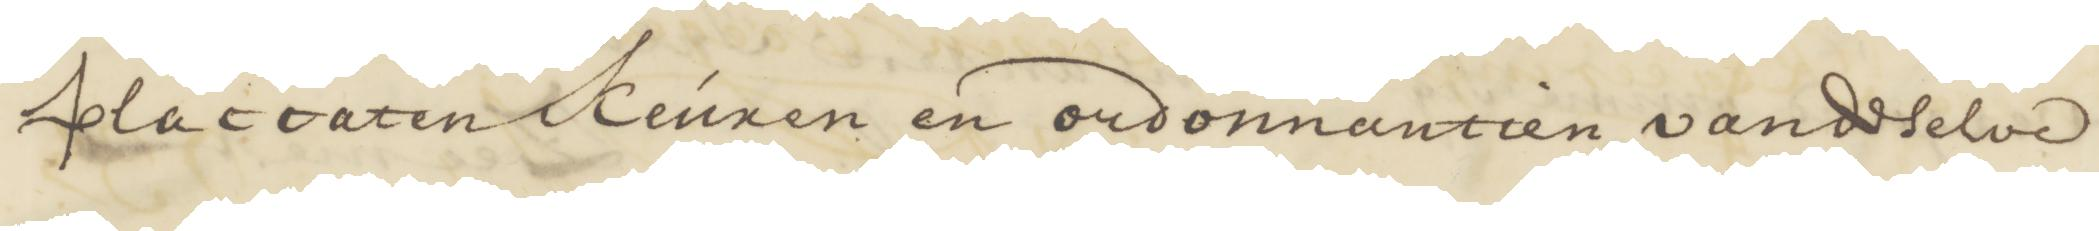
placcaten keuren en ordonnantien van deselve
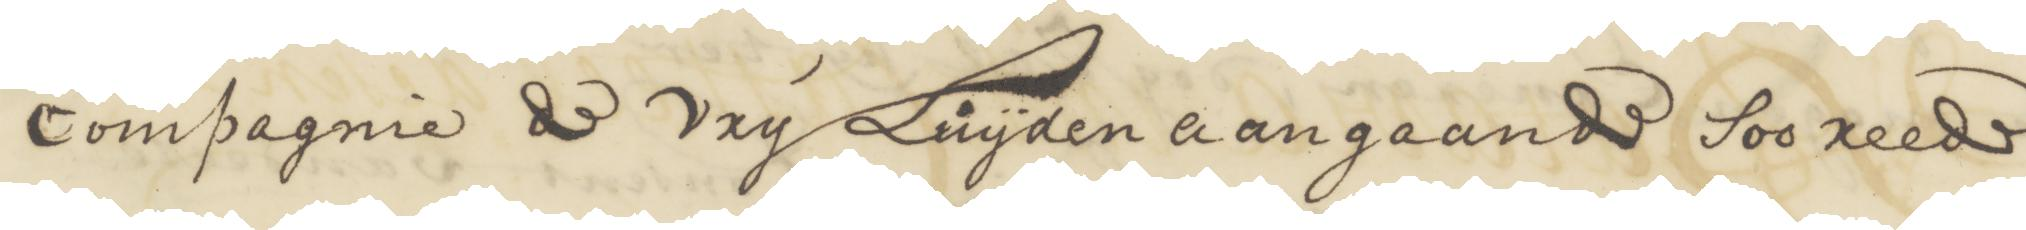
compagnie de vrij Luijden aangaande soo reede
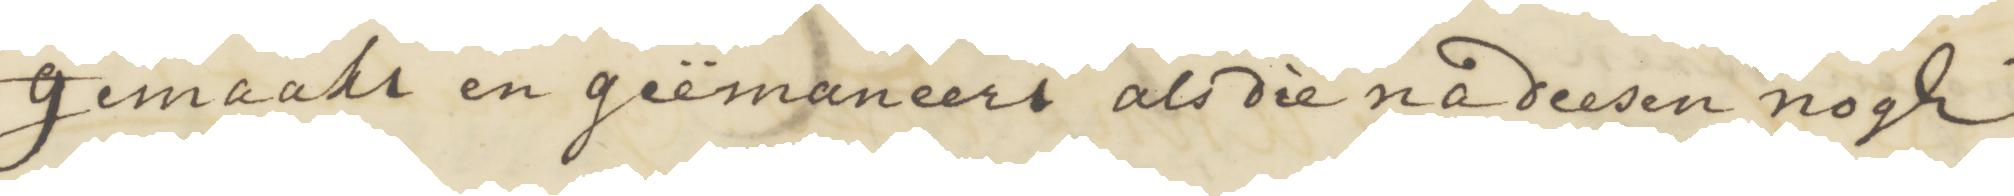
gemaakt en geëmaneert als die na deesen nogh
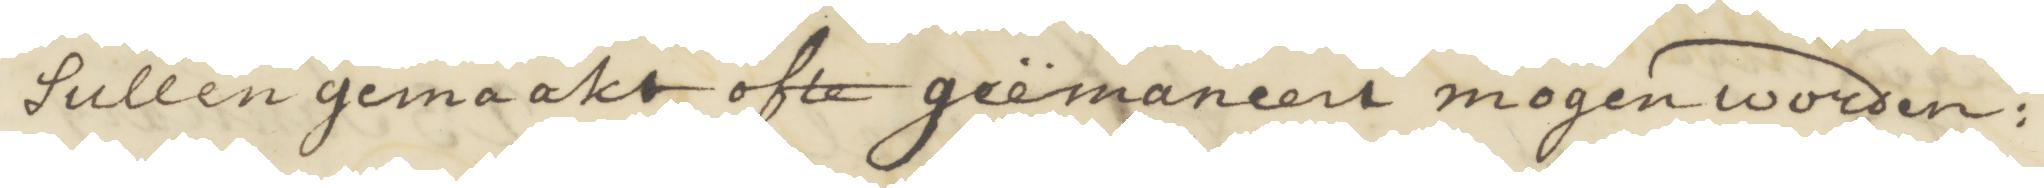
sullen gemaakt ofte geëmaneert mogen worden:
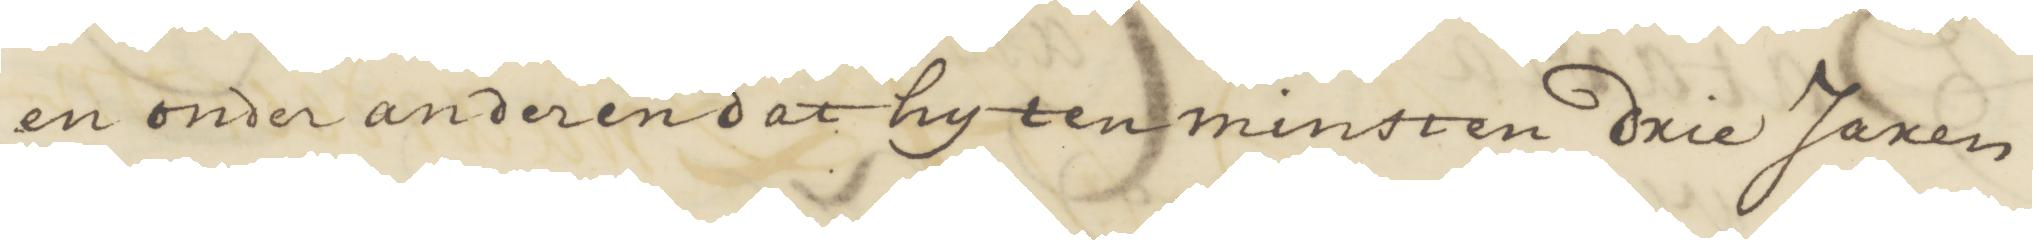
en onder anderen dat hy ten minsten drie Jaren
